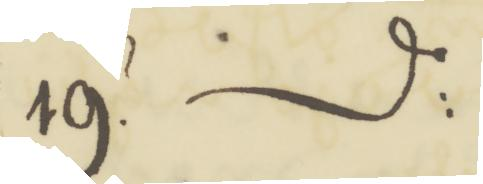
19.' D:
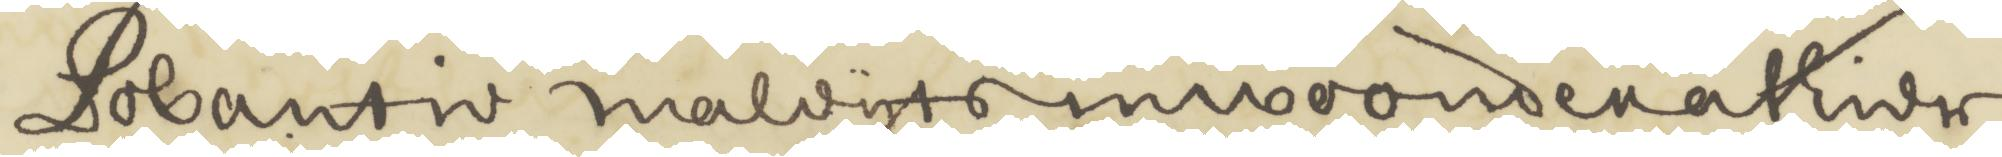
Pobantie maleijts inwoonder alhier
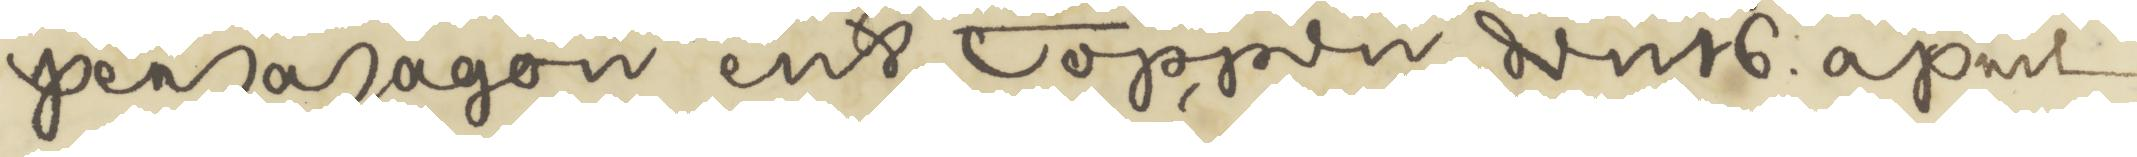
per jajagon en8. Coppen den16. april
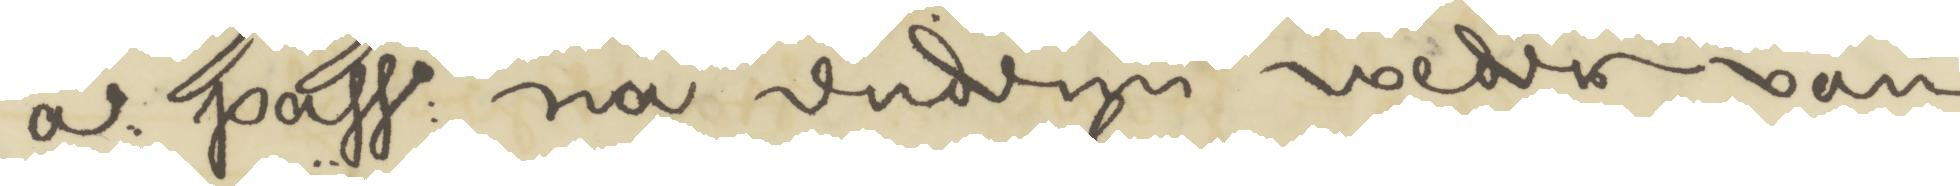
a:o pass:o na ende nu weder van
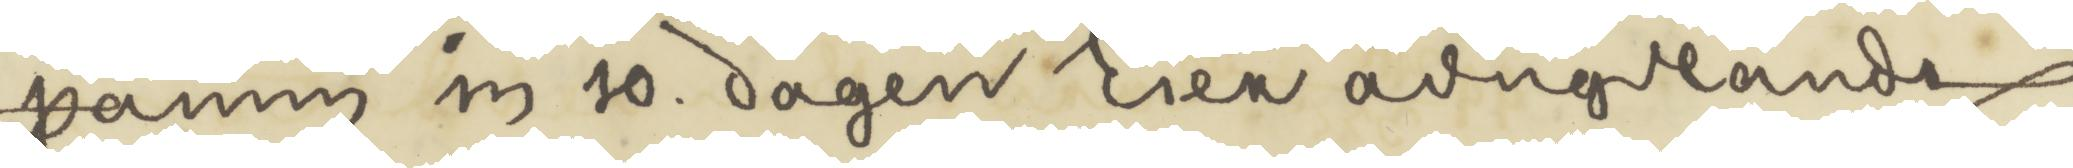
pannij in 10. dagen hier aengelandt
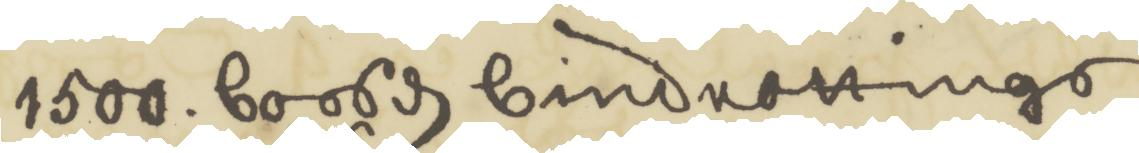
1500. bossen bindrottings
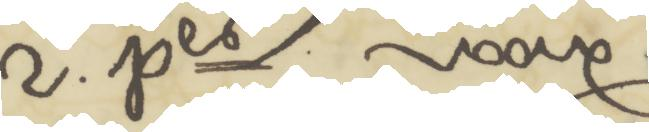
2. p=ls wax
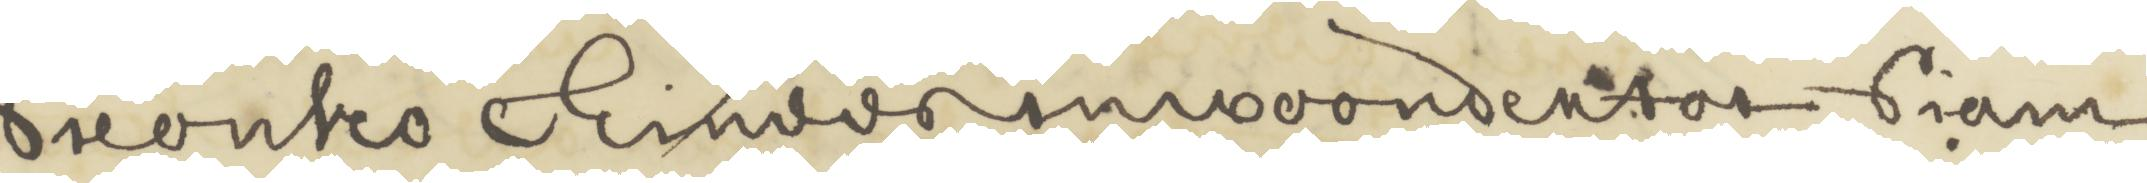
Silonko Chinees inwoonder tot Siam
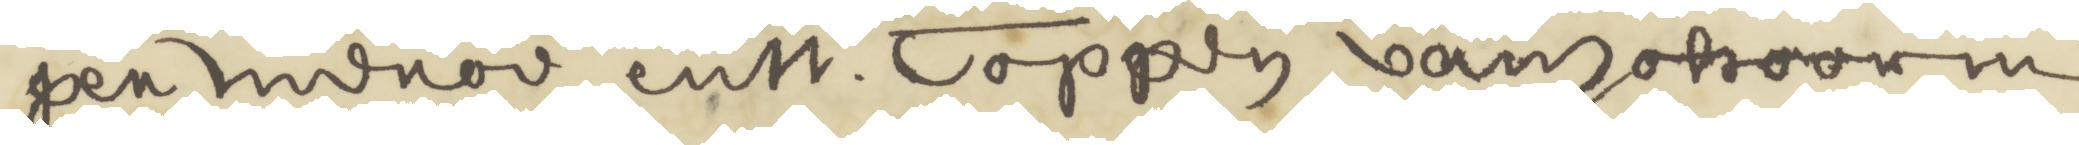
per meroe en 11. Coppen van Johoor in
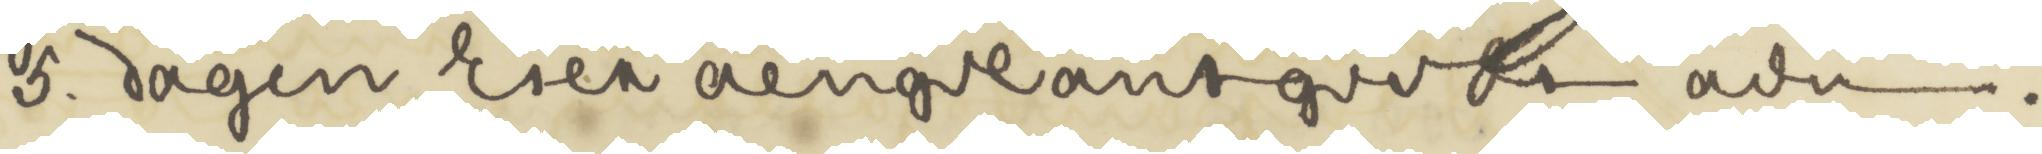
5. dagen hier aengelant geeft aen.
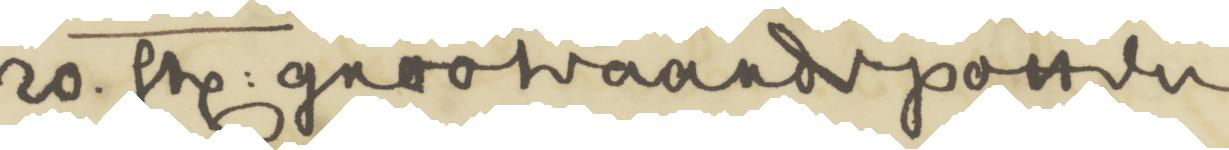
20. stx: grooteaardepotten
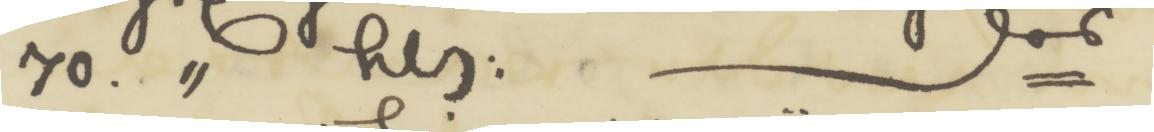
70. „ kl:en D=os
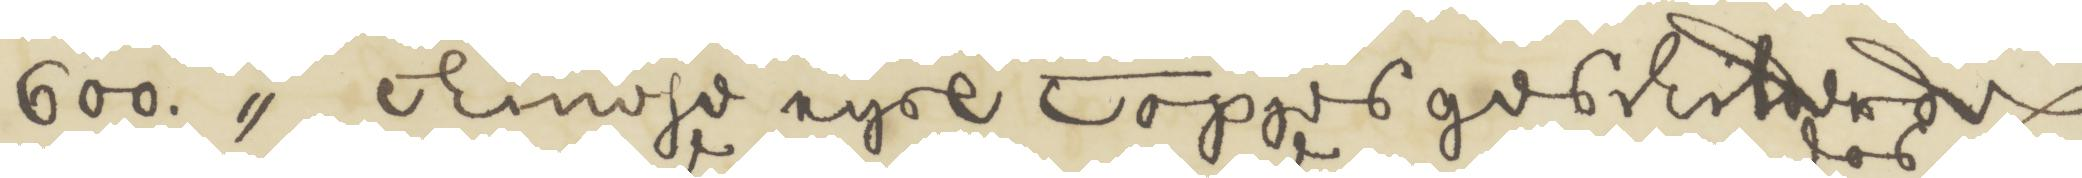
600. „ Chinese rijst Copjes geschilderde
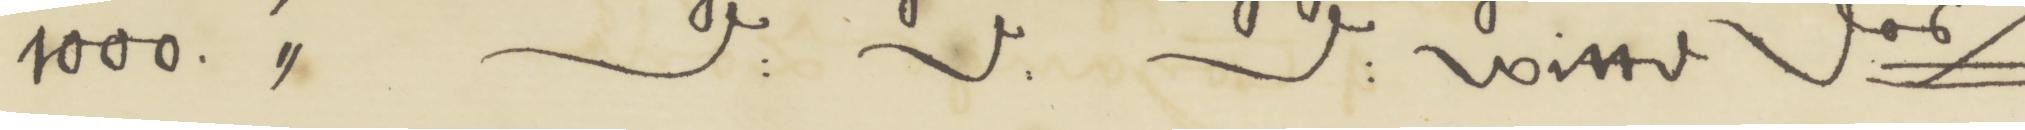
1000. „ - - - witte D =os
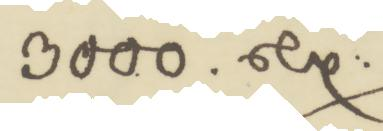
3000. stx:
